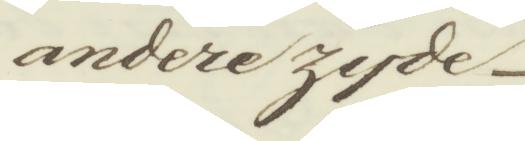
andere zyde-
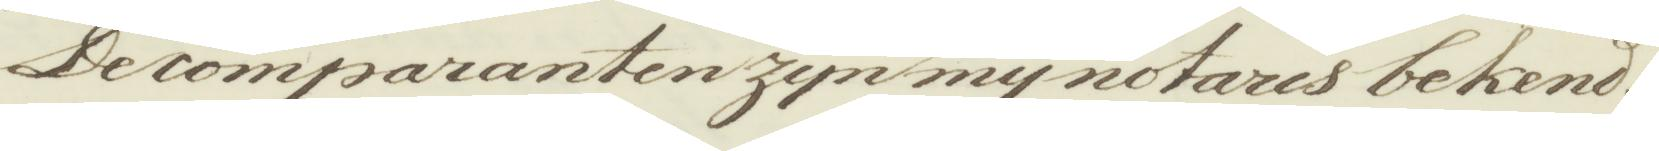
De comparanten zijn my notaris bekend-
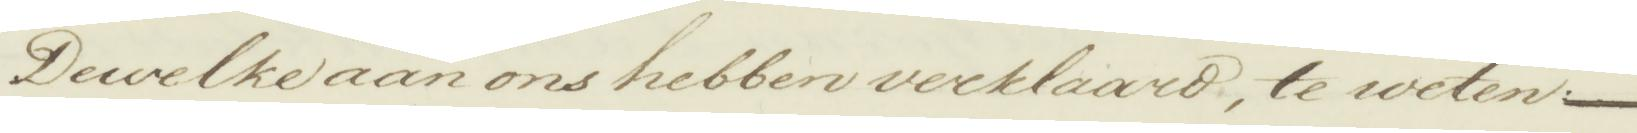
Dewelke aan ons hebben verklaard, te weten—
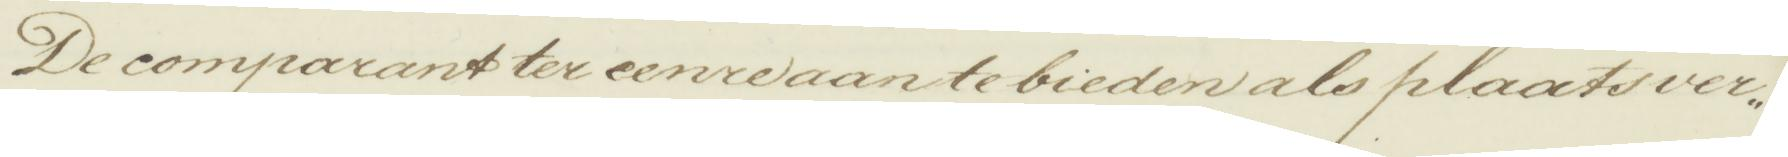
De comparant ter eenre aan te bieden als plaatsver„
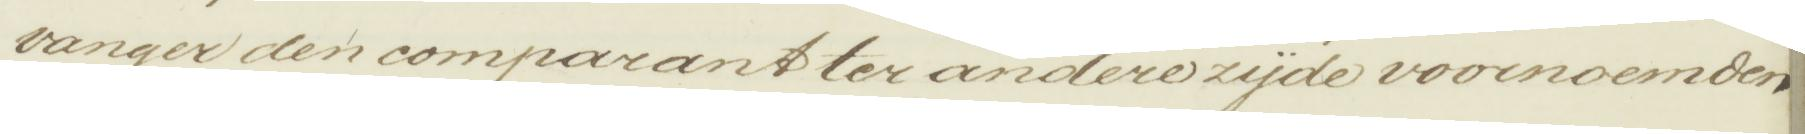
vanger den comparant ter andere zijde voornoemden
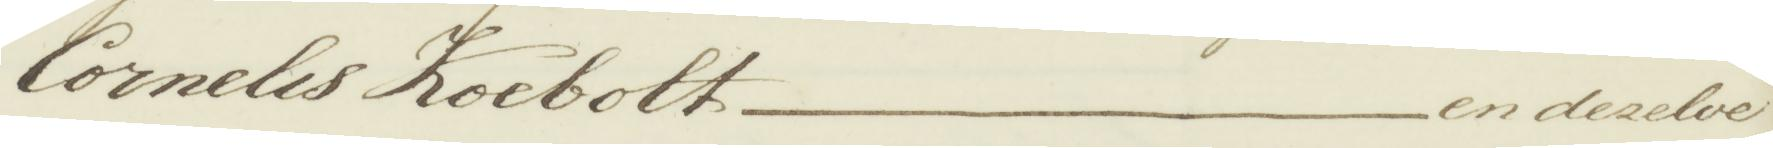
Cornelis Koebolt — en dezelve
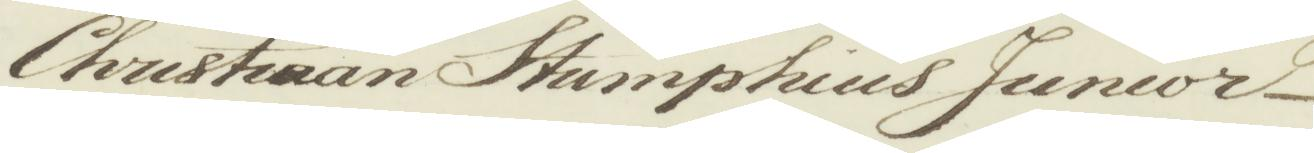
Christiaan Stumphius Junior—
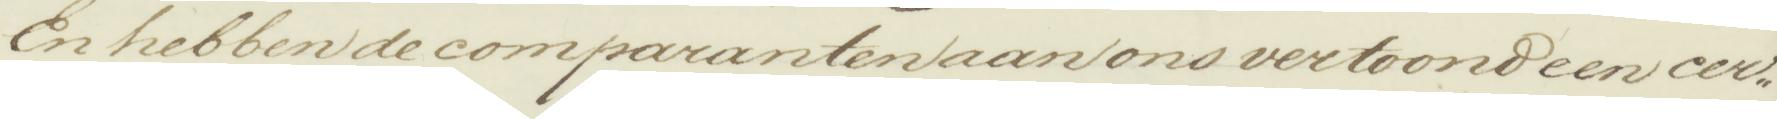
En hebben de comparanten aan ons vertoond een cer„
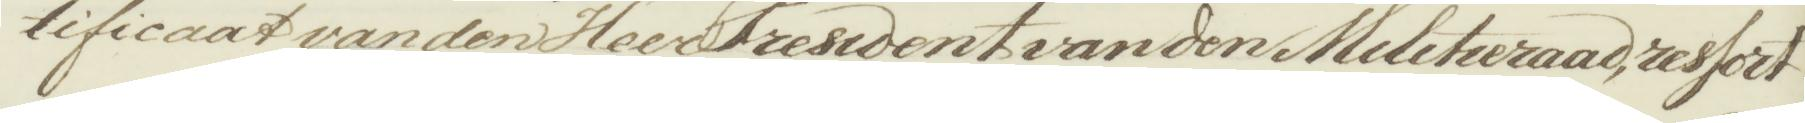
tificaat van den Heer President van den Militieraad, ressort
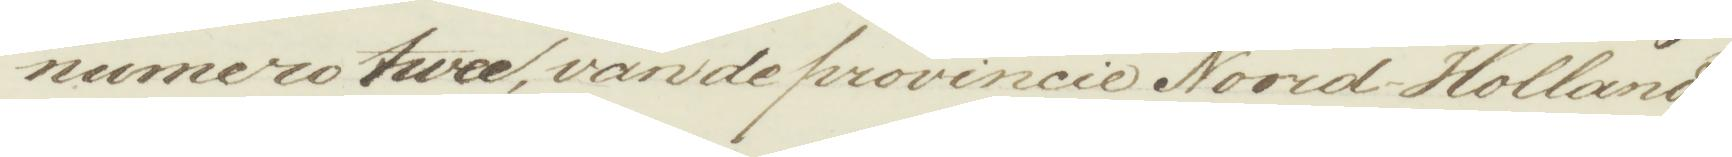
numero twee, van de provincie Noord Holland
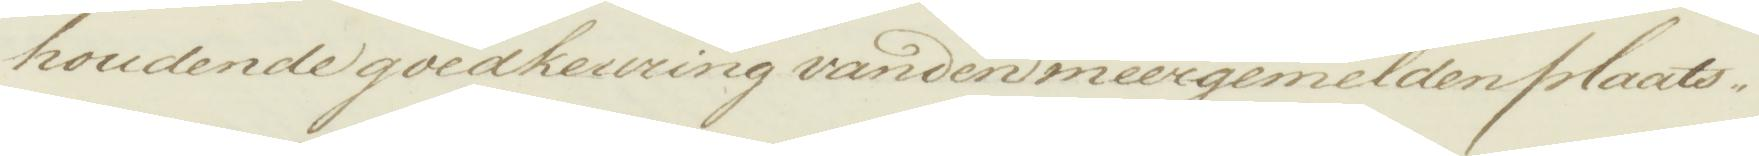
houdende goedkeuring vanden meergemelden plaats„
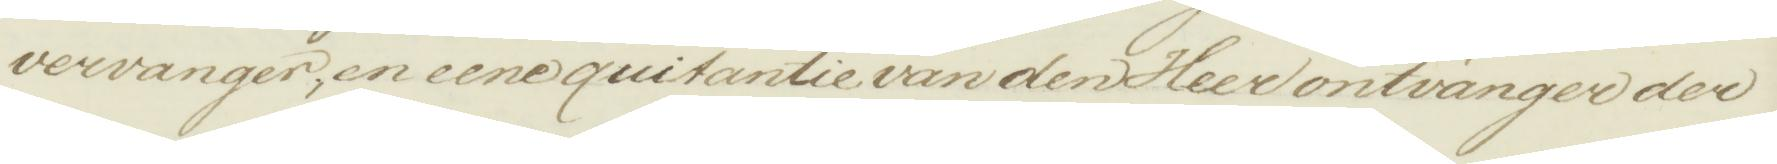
vervanger, en eene quitantie van den Heer ontvanger der
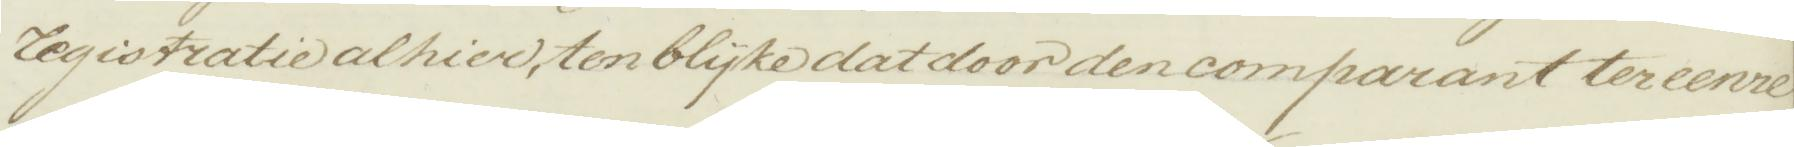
registratie alhier, ten blijke dat door den comparant ter eenre
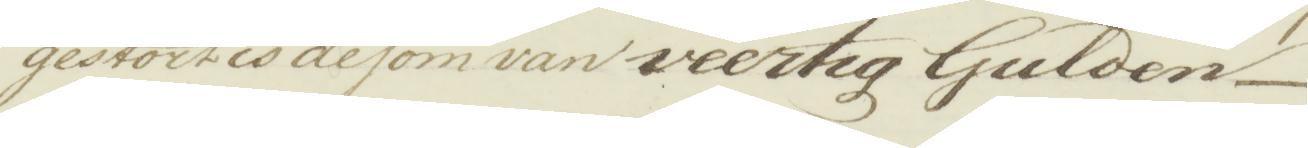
gestort is de som van veertig Gulden—
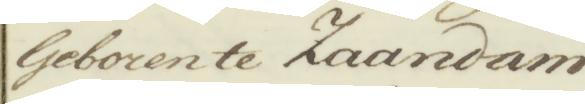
Geboren te Zaandam
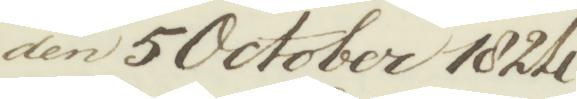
den 5 October 1824
